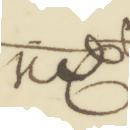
rds
